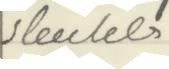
sleutels
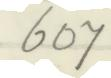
607
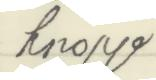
knopje
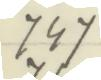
747
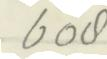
608
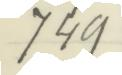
749
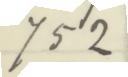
752
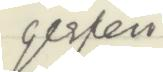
gespen
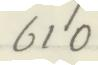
610
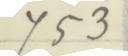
753
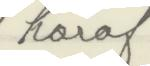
karaf
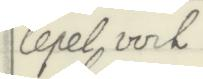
lepel, vork
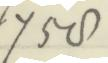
758
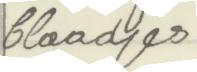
blaadjes
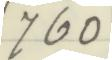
760
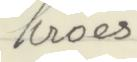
kroes
